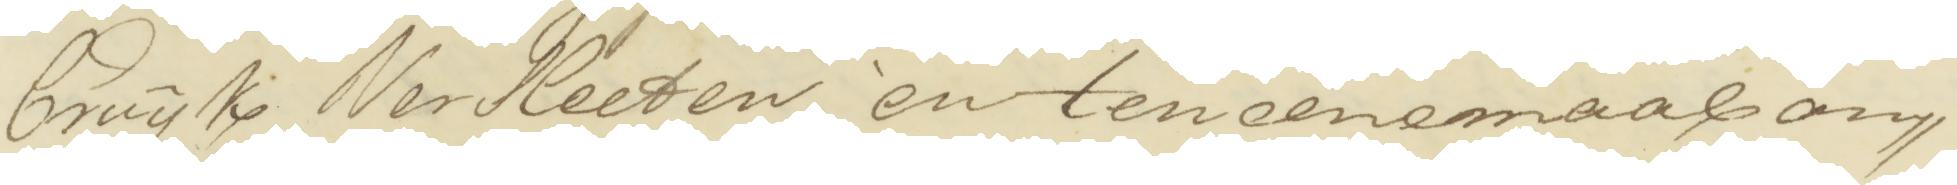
bruijk versleeten en ten eenemaal on„
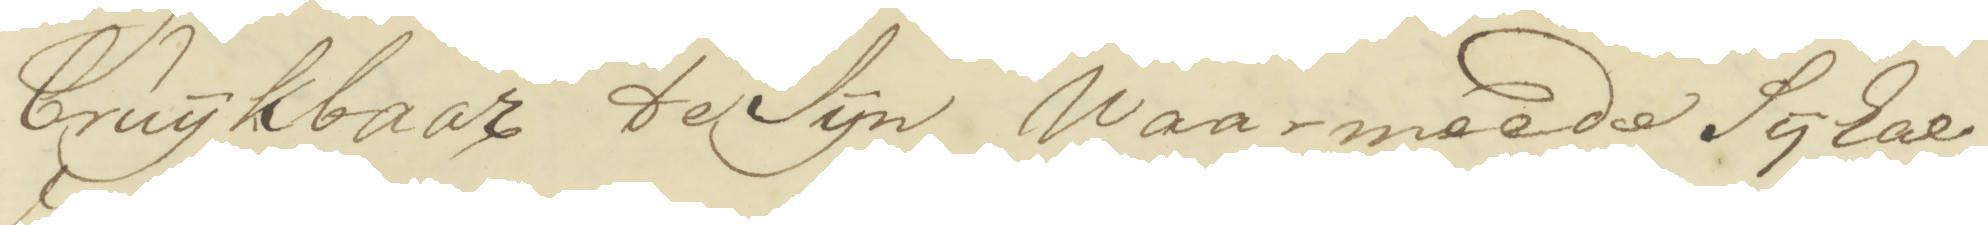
bruijkbaar te sijn waarmeede sij hae
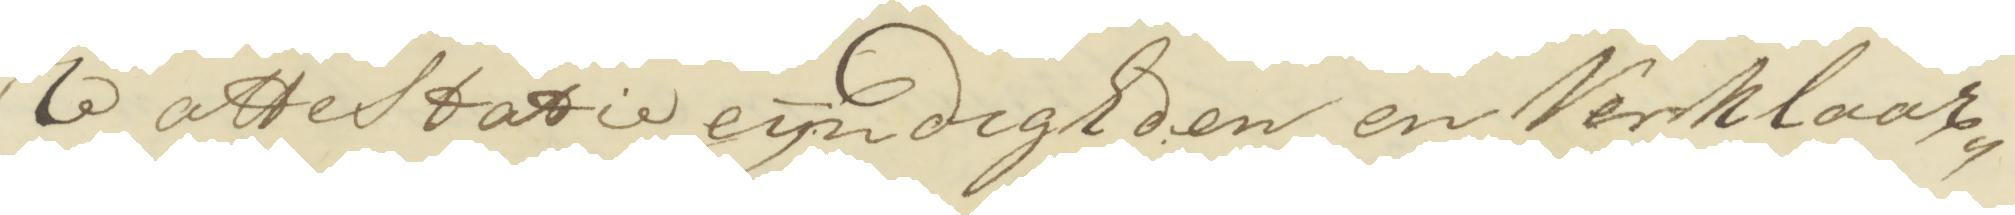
re attestatie eijndighden en Verklaar„
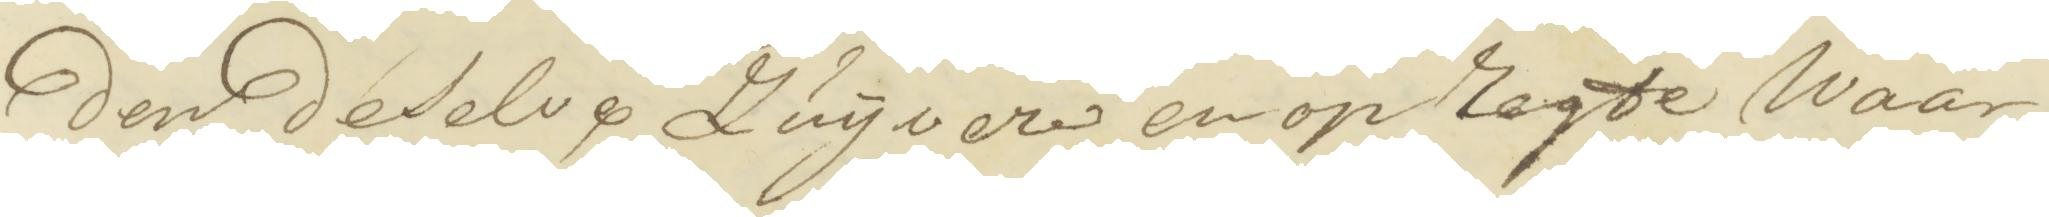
den deselve zuijvere en op Regte waar
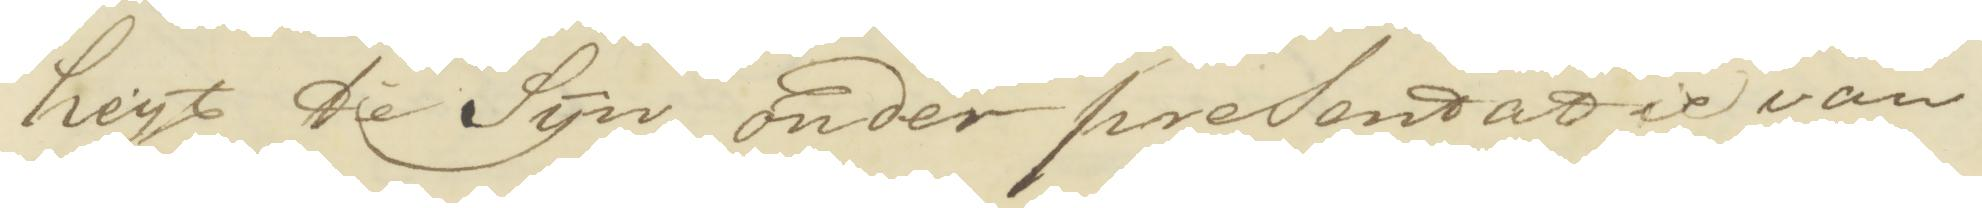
heyt die sijn onder presentatie van
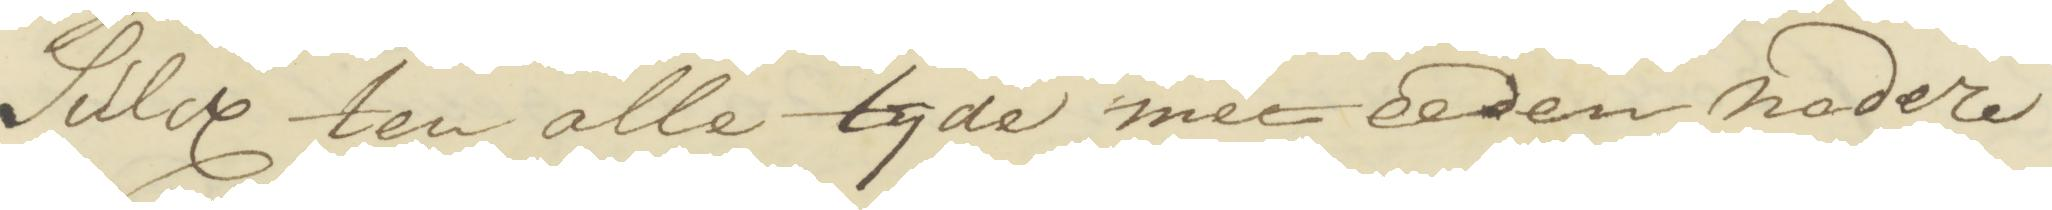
sulx ten alle tijde met eeden nadere
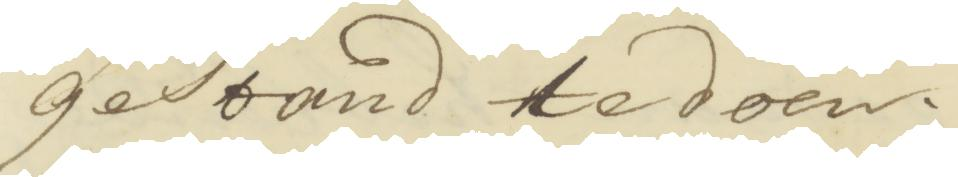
gestand te doen.
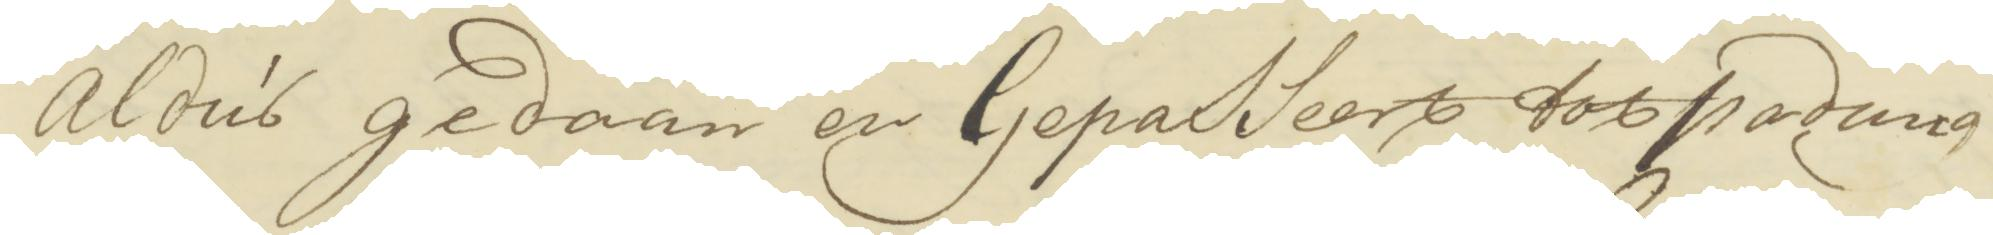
Aldus gedaan en gepasseert tot padang
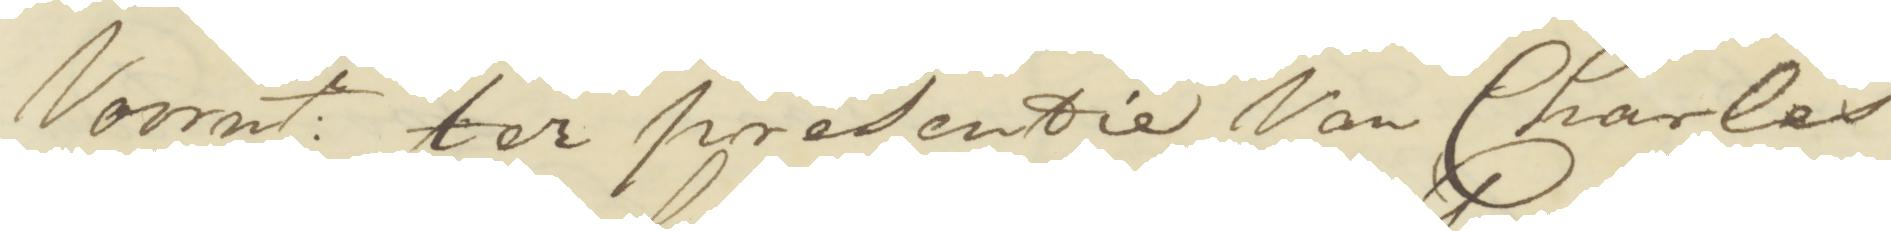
Voornt: ter presentie van Charles
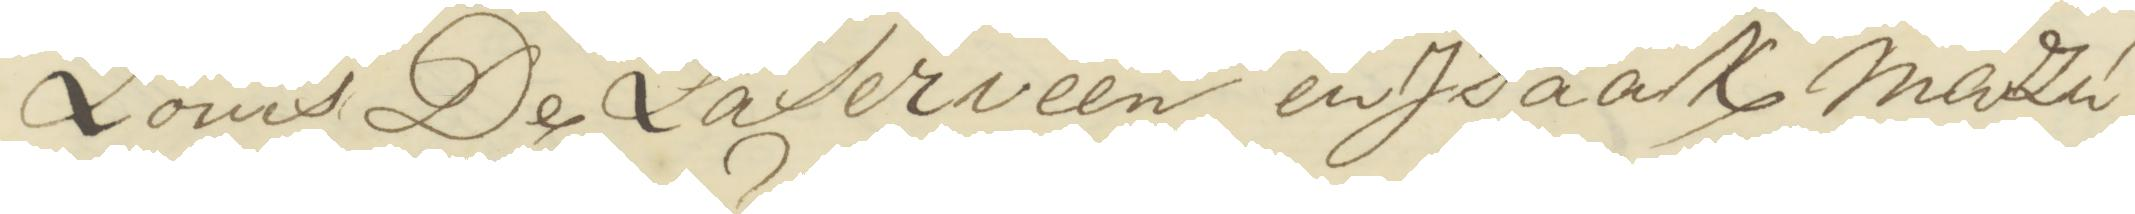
Louis De Laserveen en Jsaak Mazu
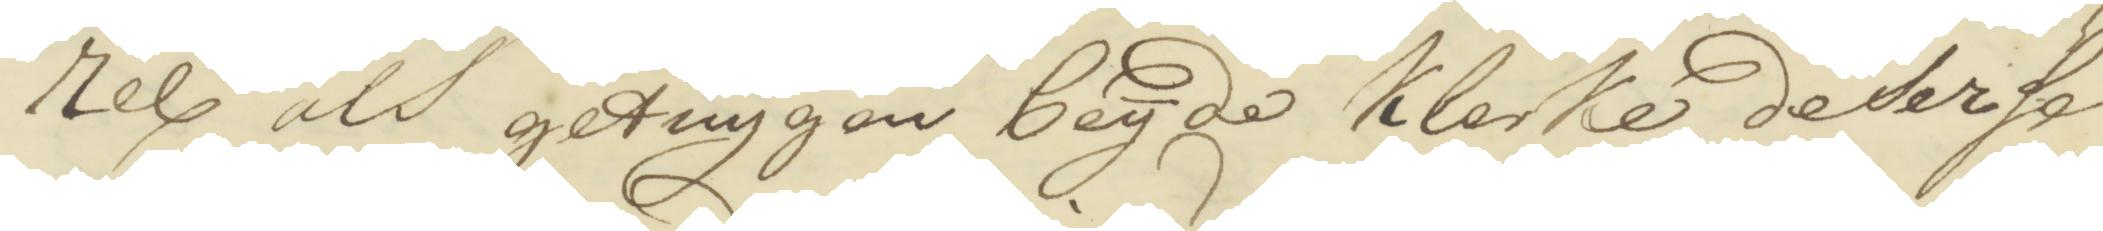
rel als getuijgen beijde klerke deser se
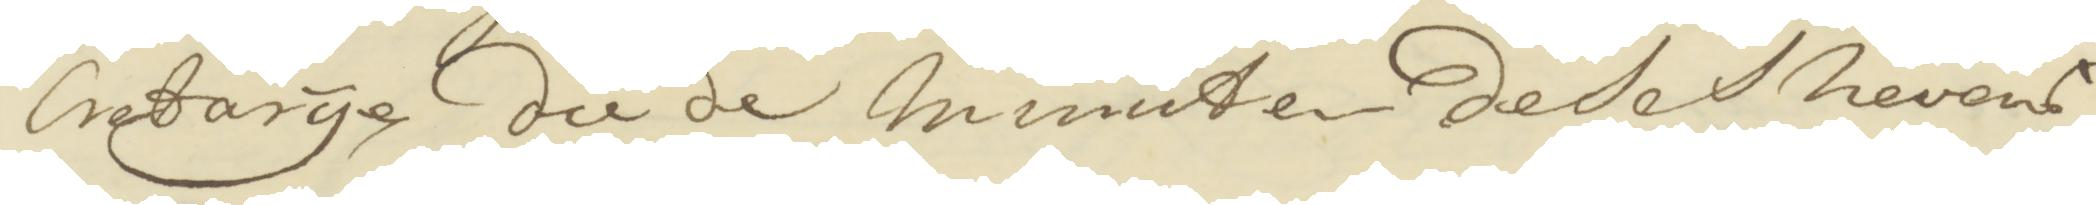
cretarije, die de minuten deses nevens
